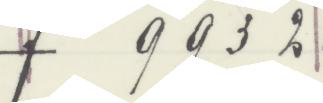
ƒ 9932
